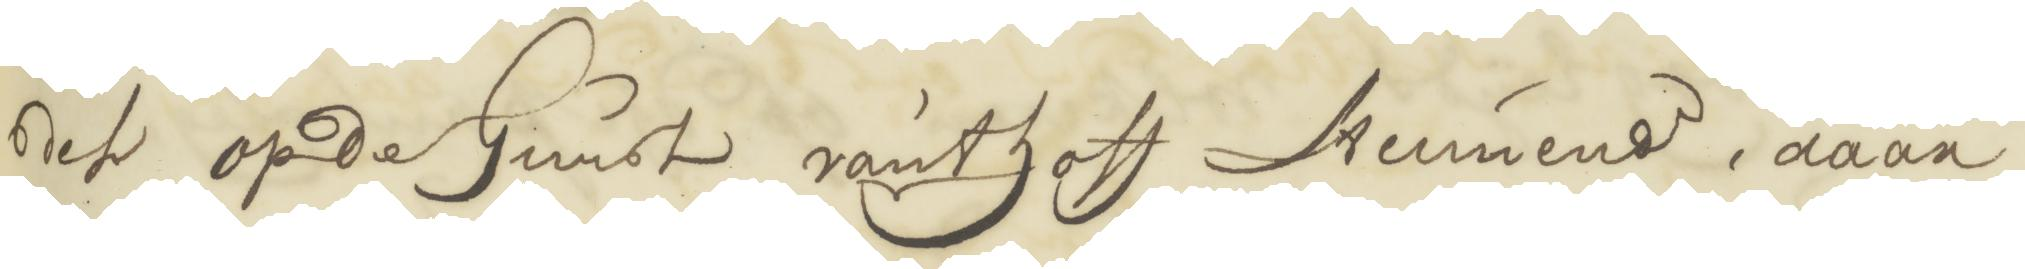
dese op de Gunst van't hoff steunende, daar
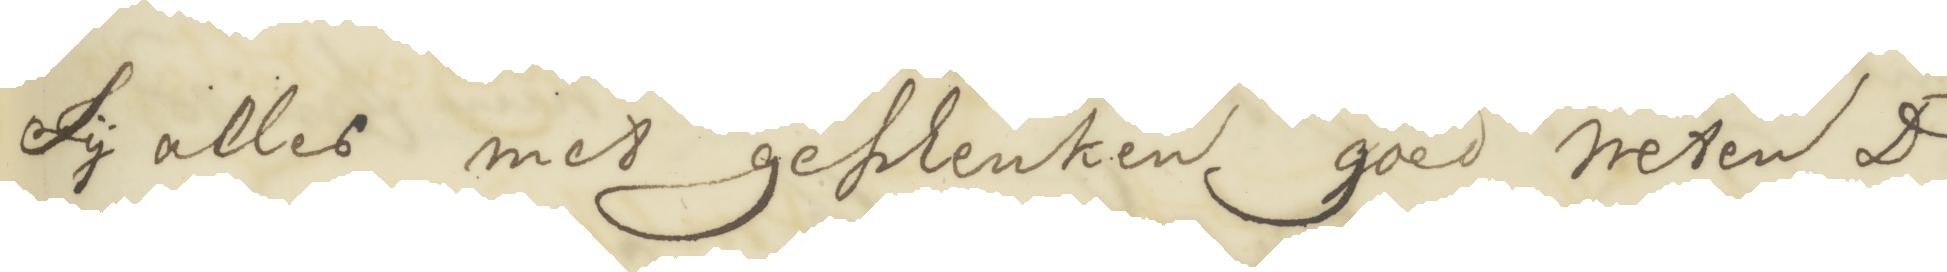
sij alles met geschenken goed weten te
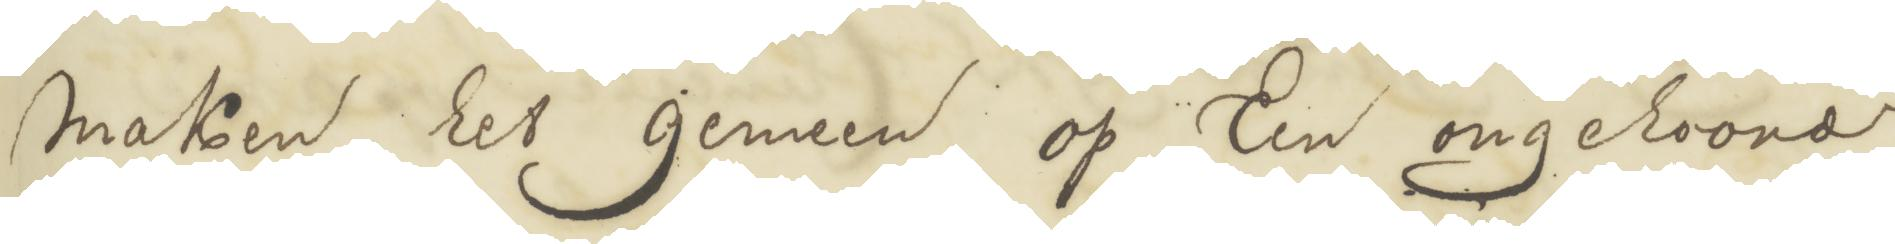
maken, het gemeen op Een ongehoorde
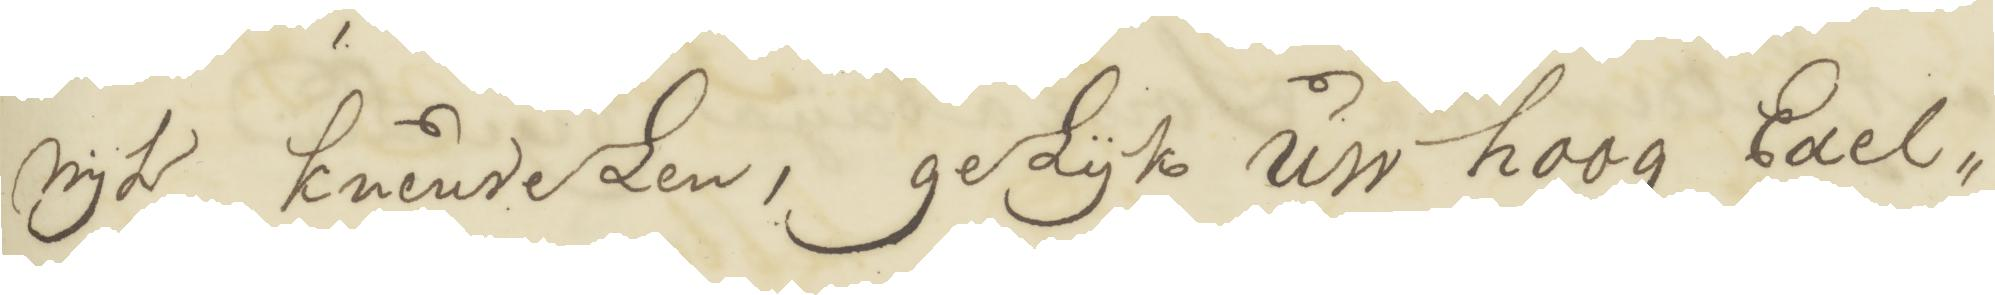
wijse kneuvelen, gelijk uw hoog Edel„
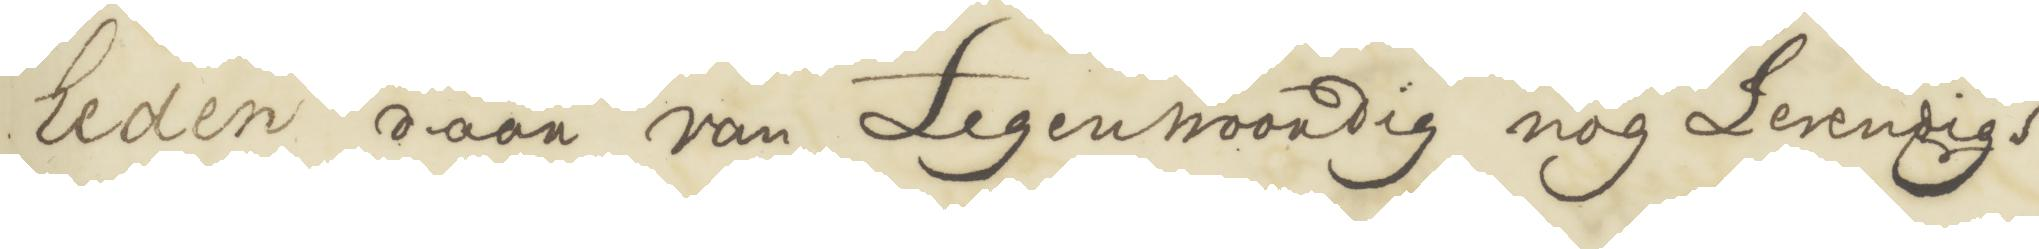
„heden daar van tegenwoordig nog levendige
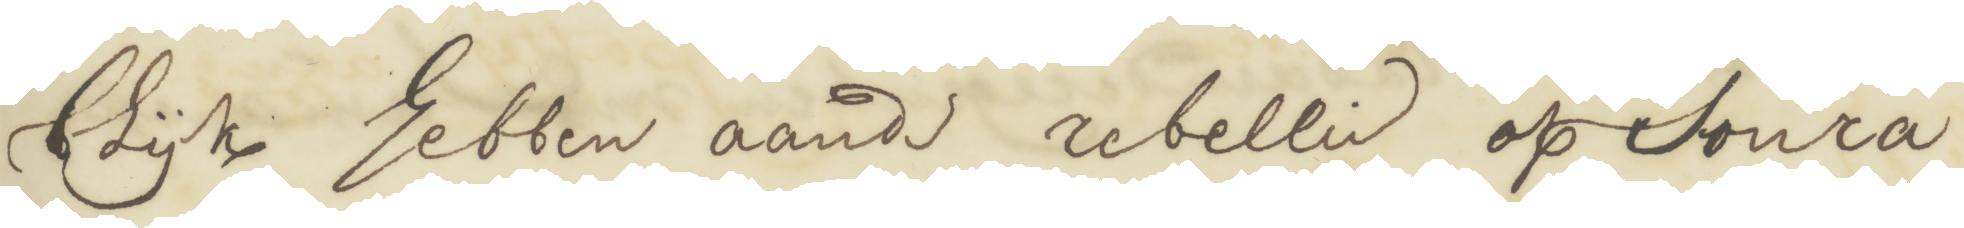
blijk hebben aande rebellie op soura
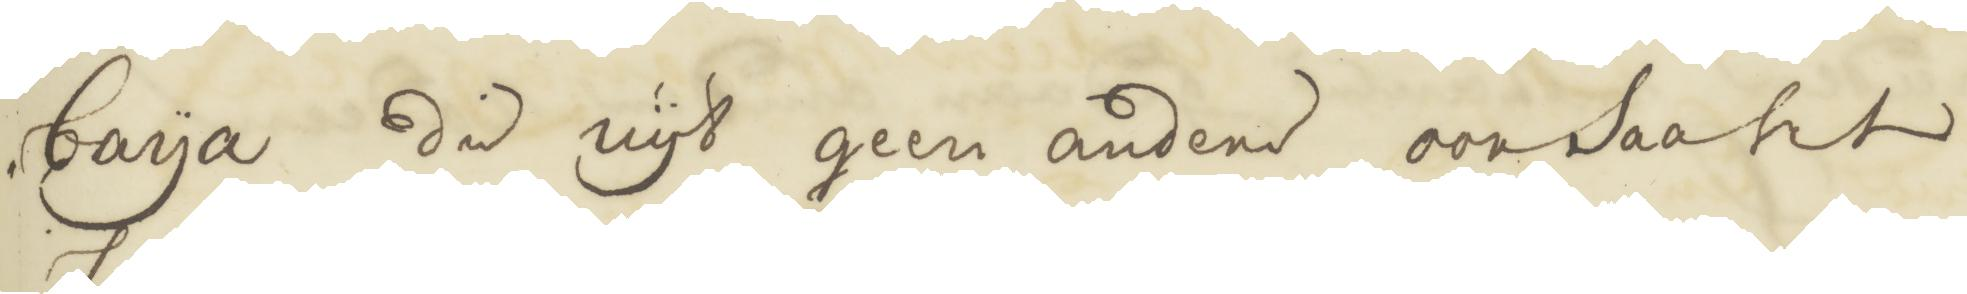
„baija die uijt geen andere oorsaakt
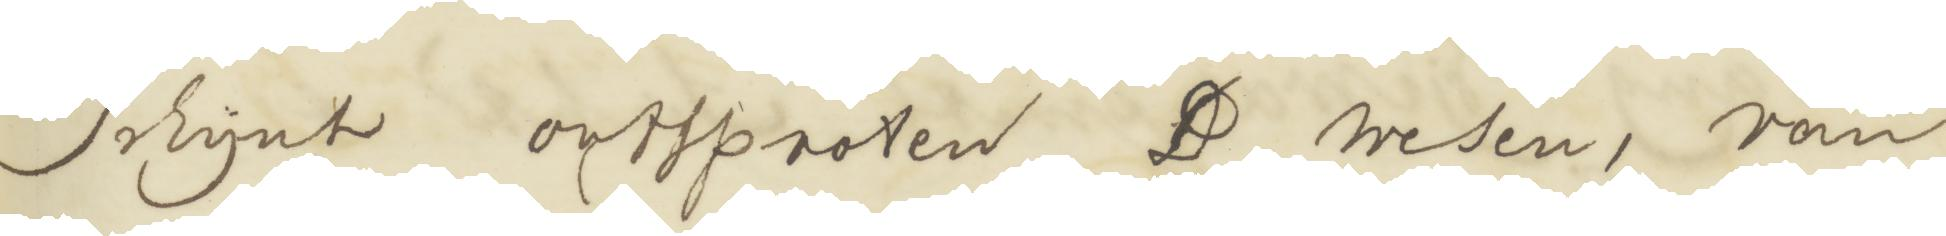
schijnt ontsproten te wesen, van
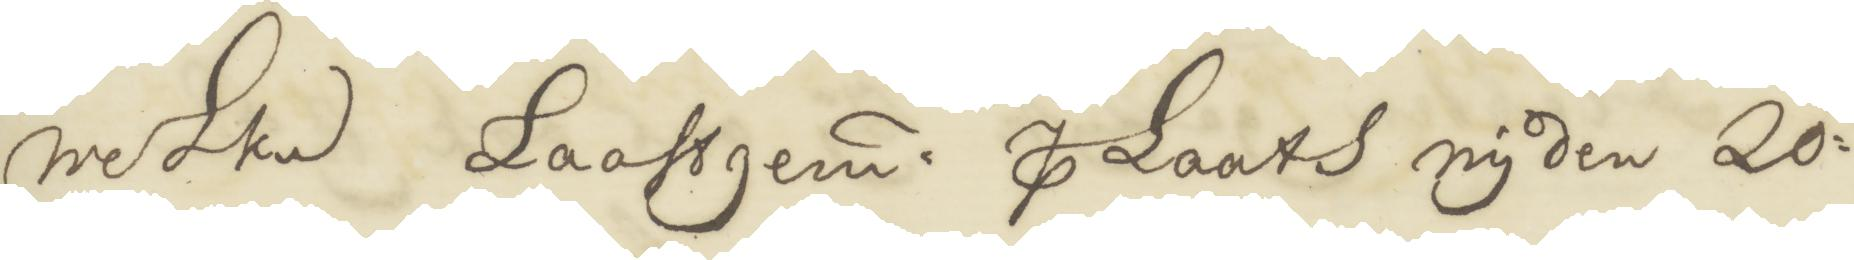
welke laastgem: plaats wij den 20:
